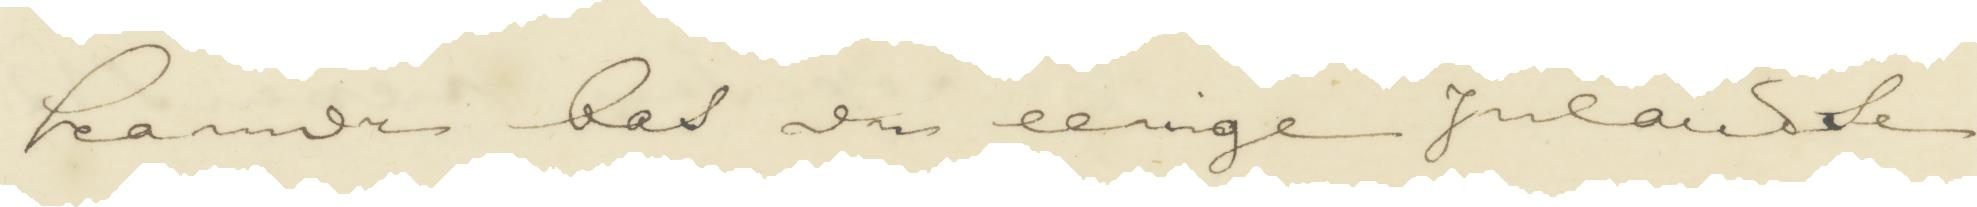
kamer bas en eenige jnlandse
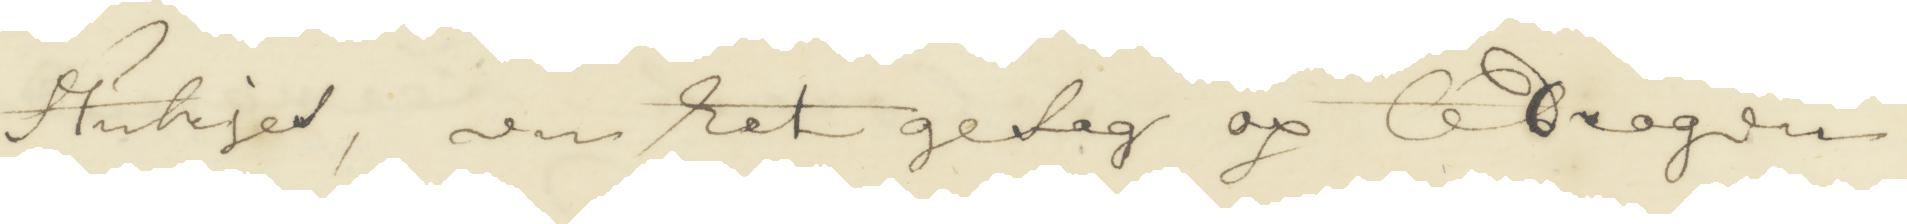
stukjes, en het gesag op te dragen
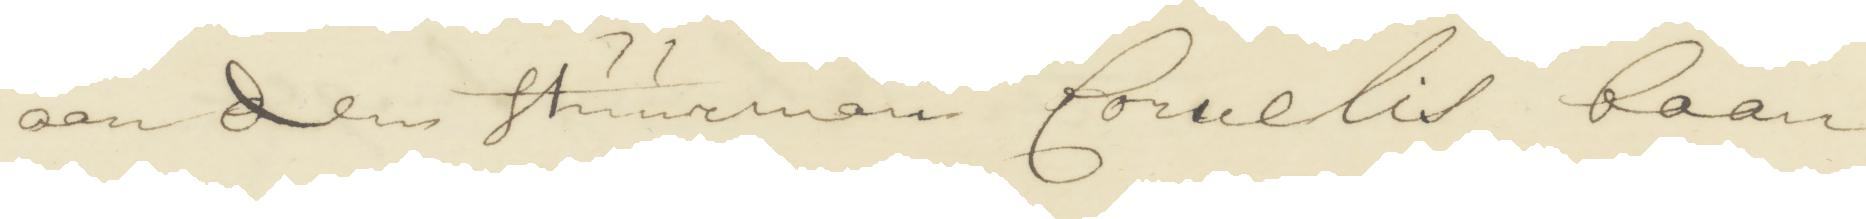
aan den stuurman Cornelis baan
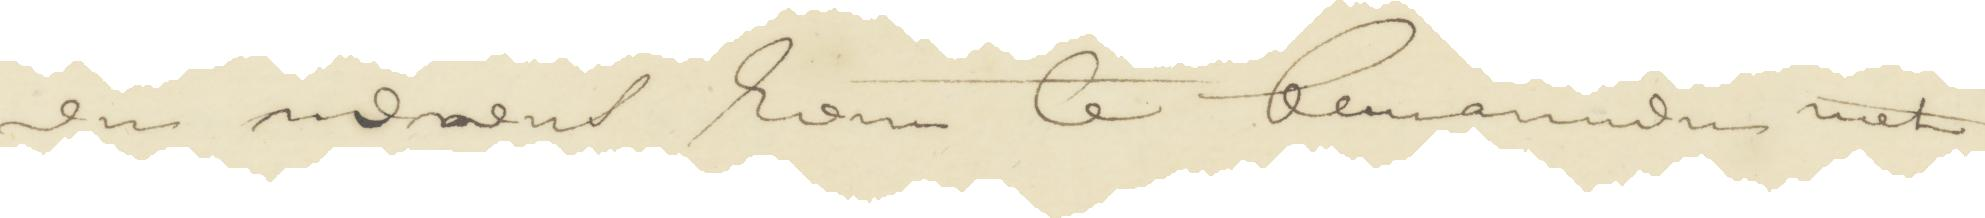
en nevens hem te bemannen met
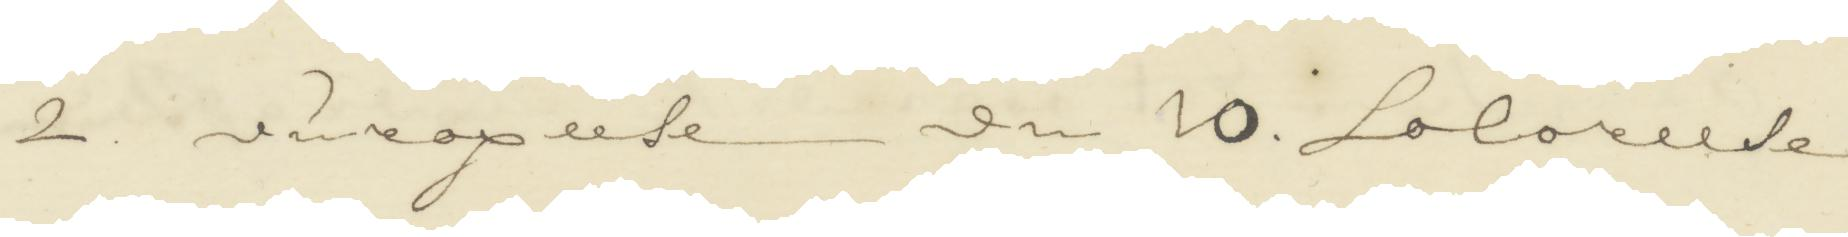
2. europeese en 10. soloreese
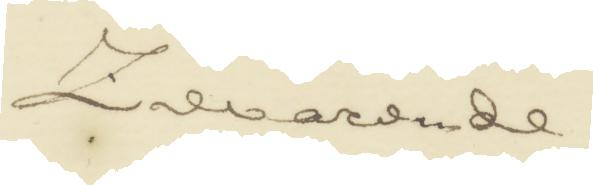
Zevarende
